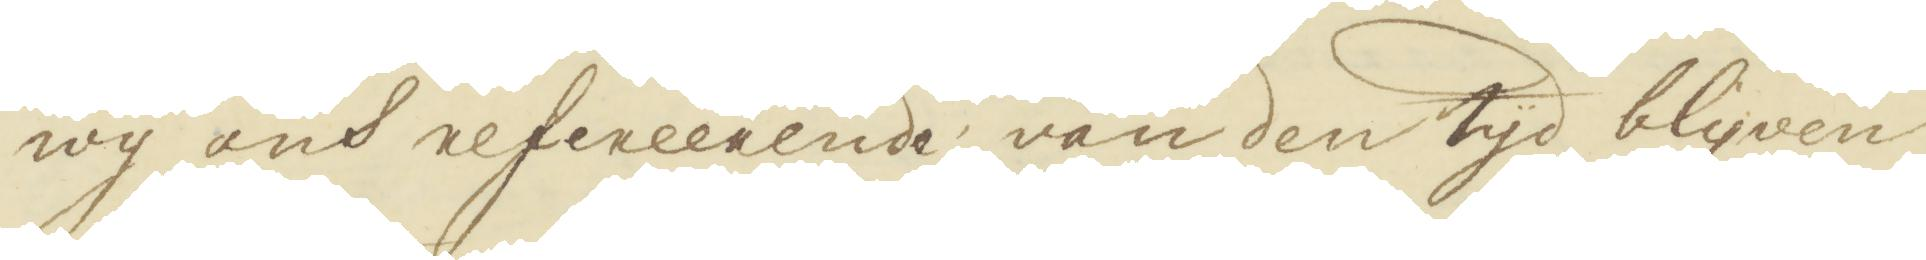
wij ons refereerende van den tijd blijven
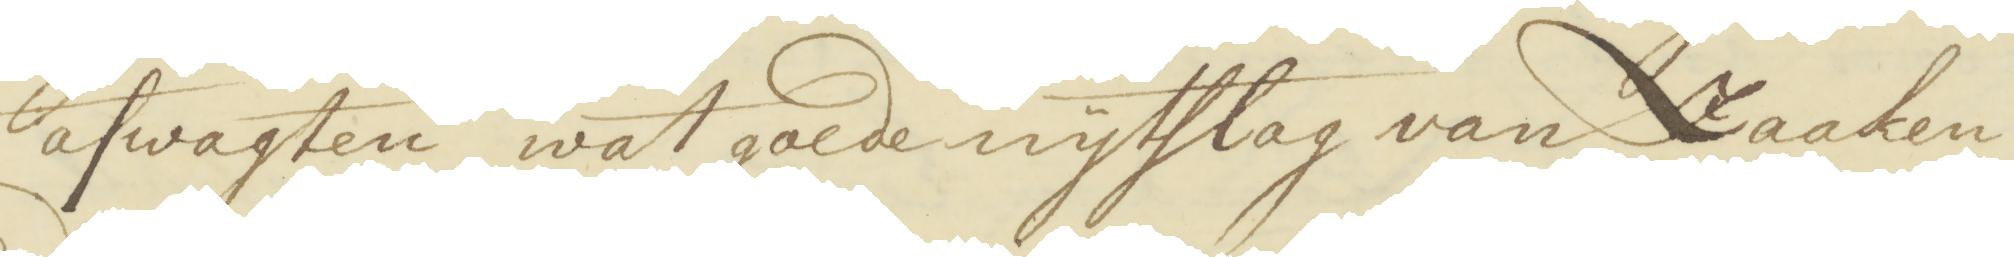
afwagten wat goede uijtslag van Zaaken
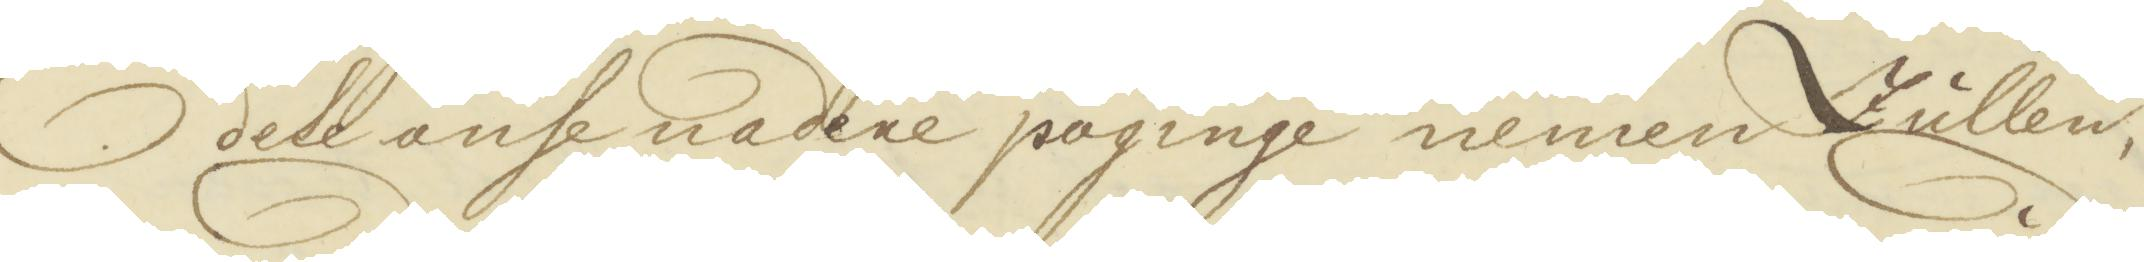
dese onse nadere poginge nemen Zullen,
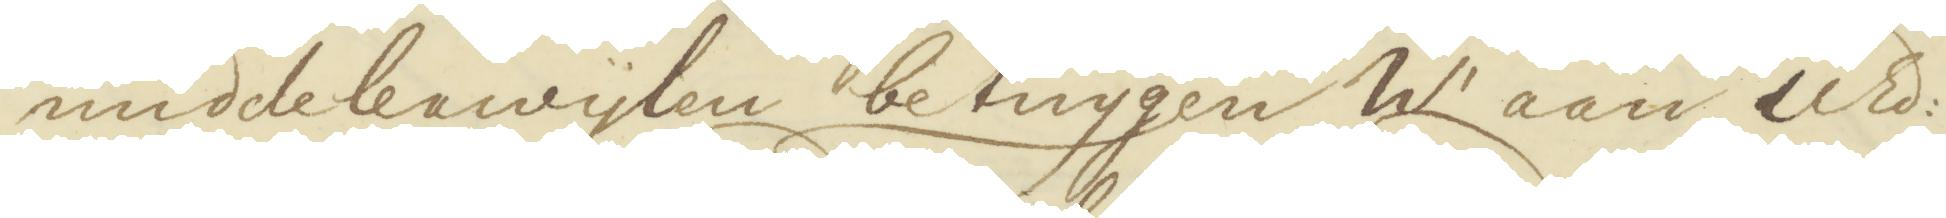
middelerwijlen betuijgen W' aan UEd:
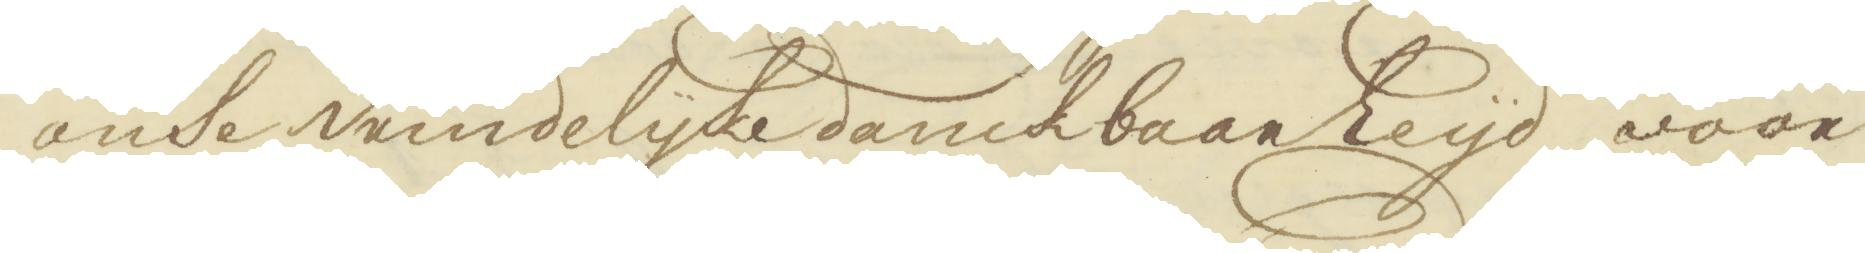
onse vrindelijke danckbaarheijd voor
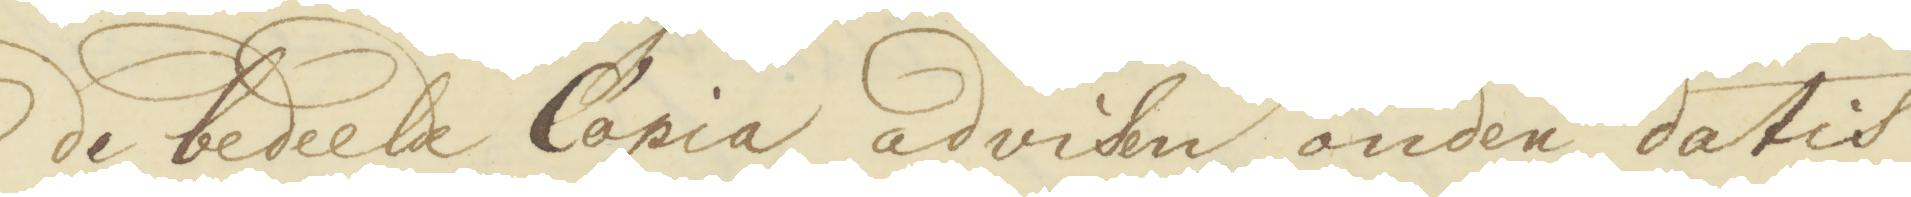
de bedeelde Copia advisen onder datis
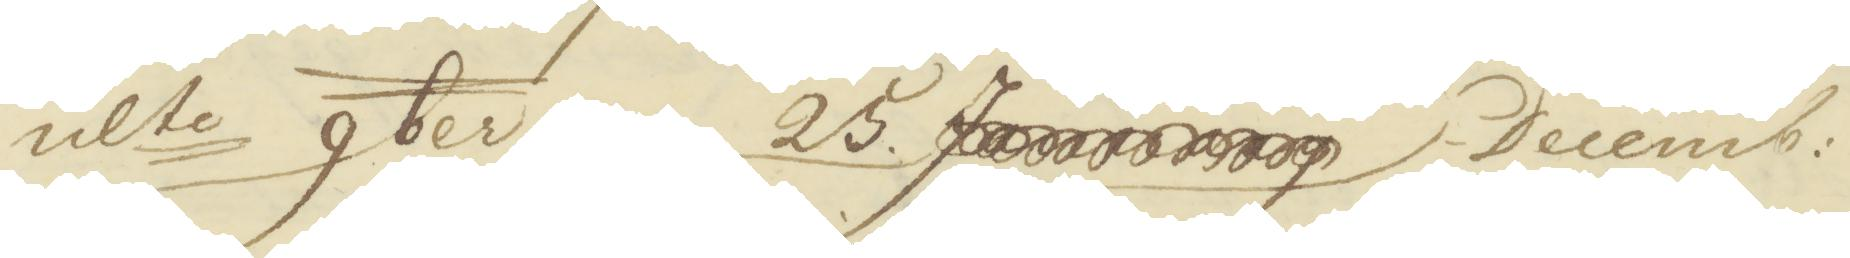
ult=o 9ber en 25. Januariis Decemb:
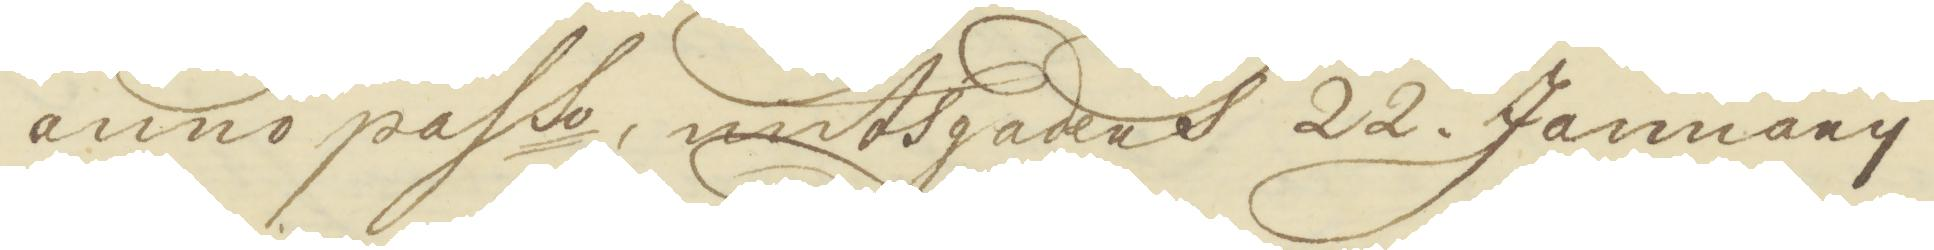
anno pass=o, mitsgaders 22. Januarij
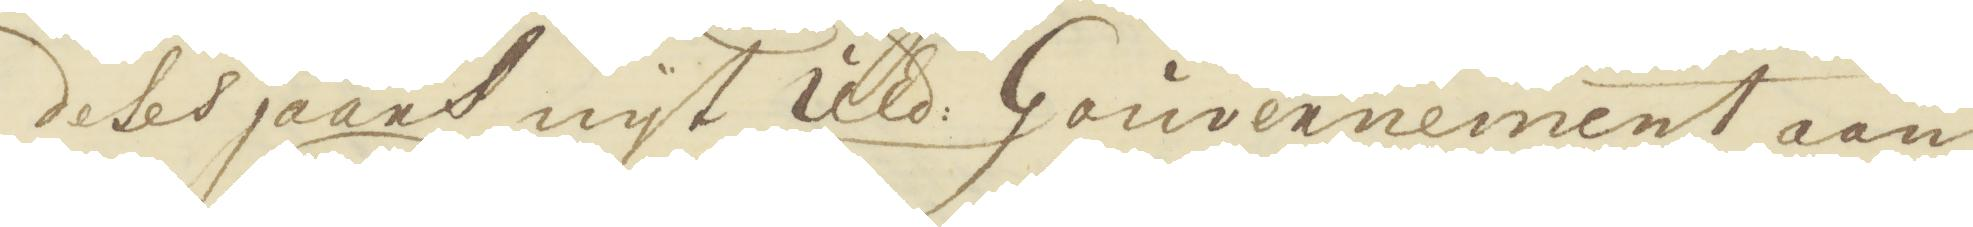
deses jaars uijt UEd: Gouvernement aan
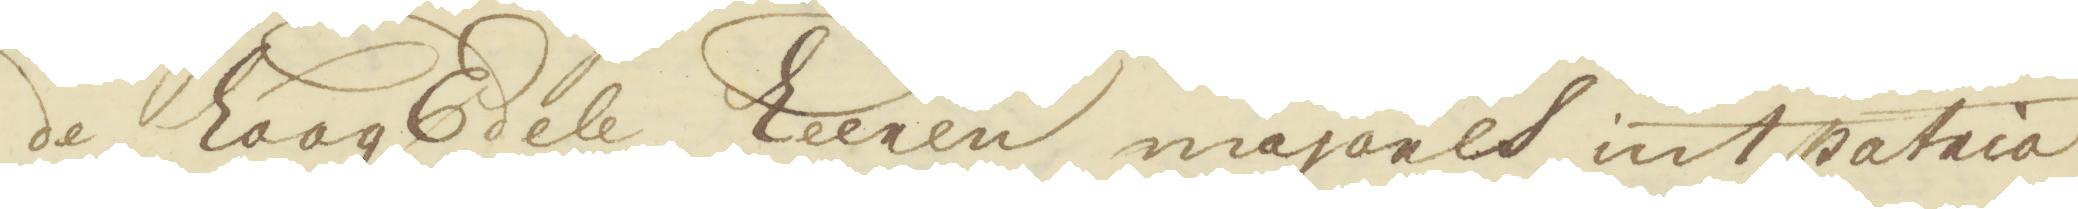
de hoog Edele heeren majores in't patria
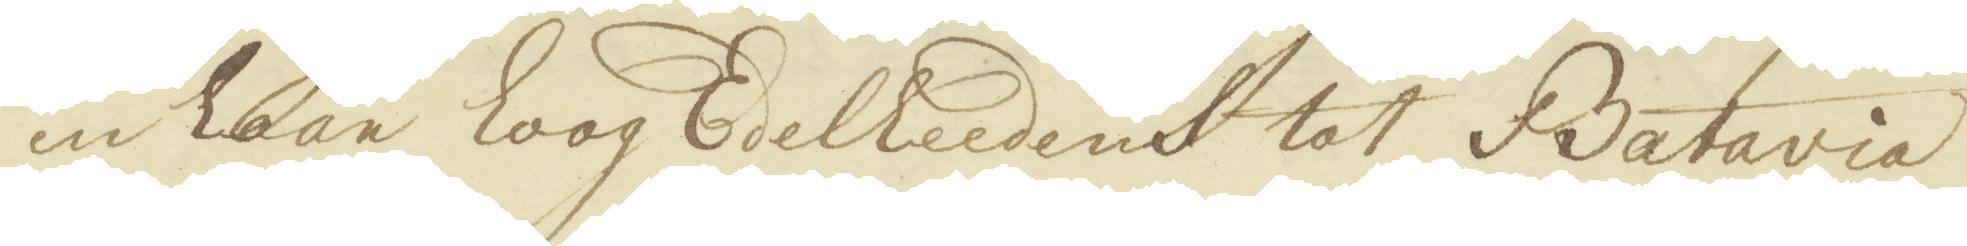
en haar hoog Edelheedens tot Batavia
